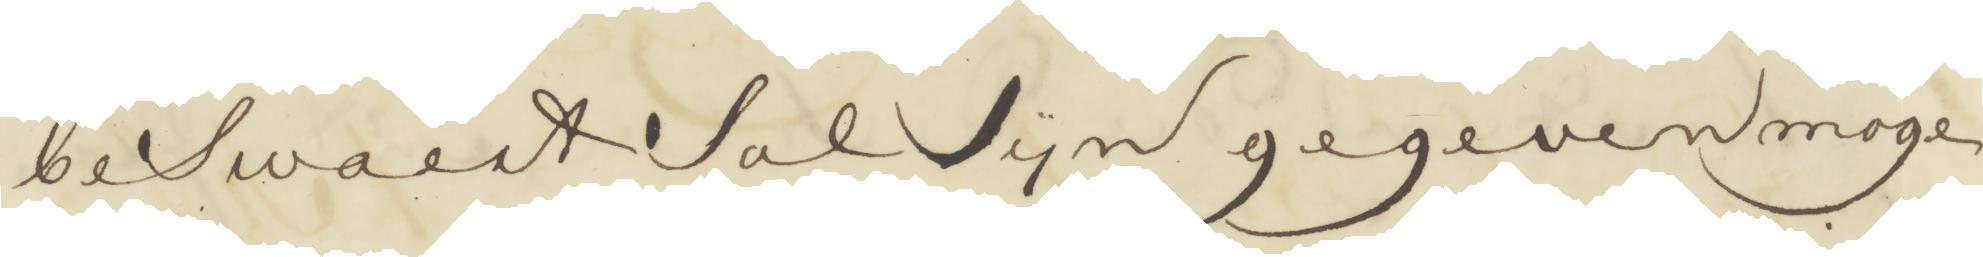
beswaert sal sijn gegeven mogen
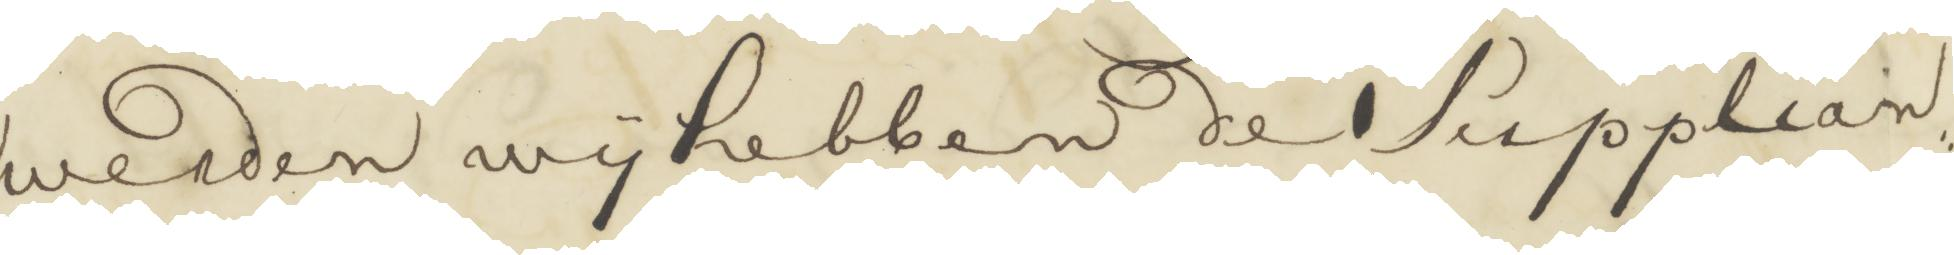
werden wij hebben de supplian
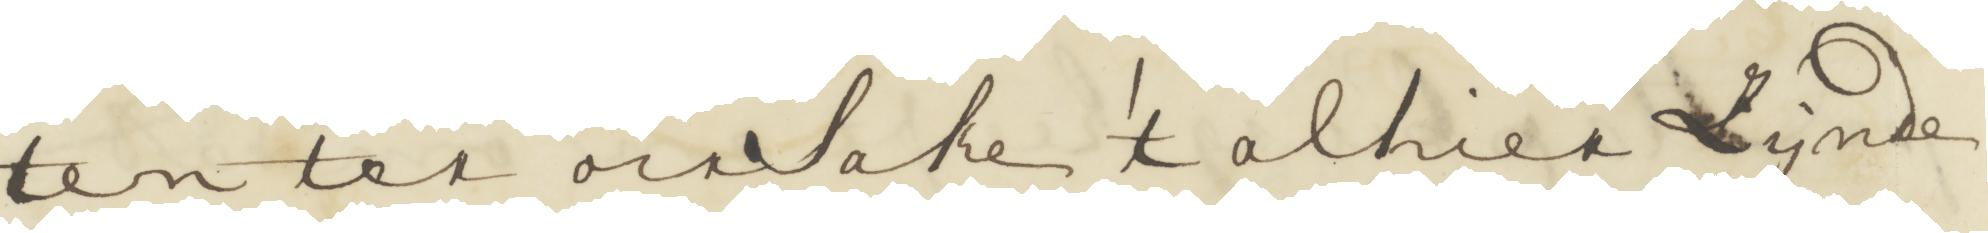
ten tot oirsake ’t alhier zijnde
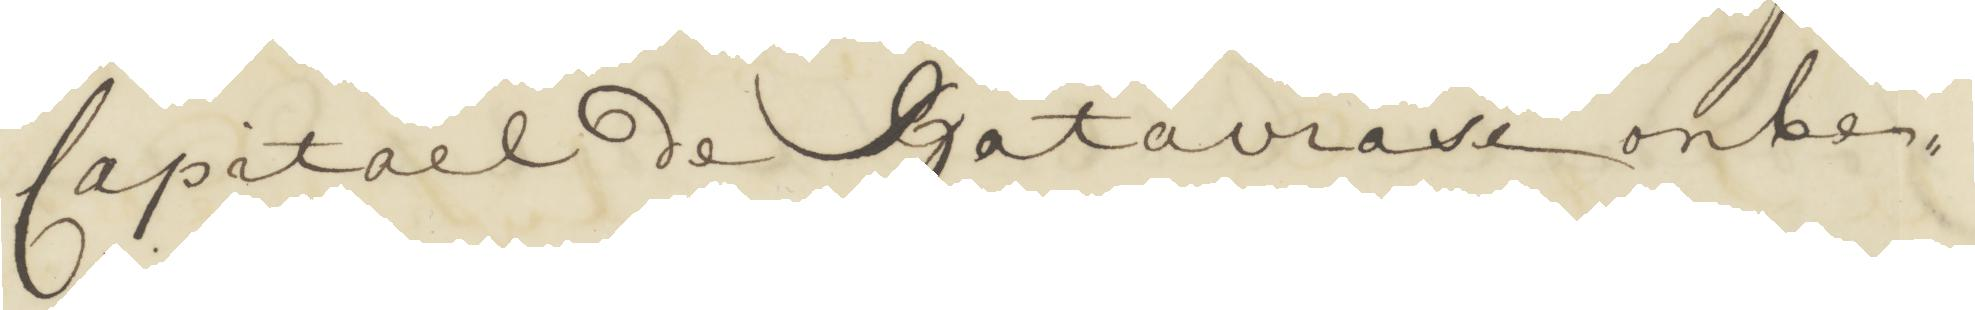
Capitael de Bataviase onbe„
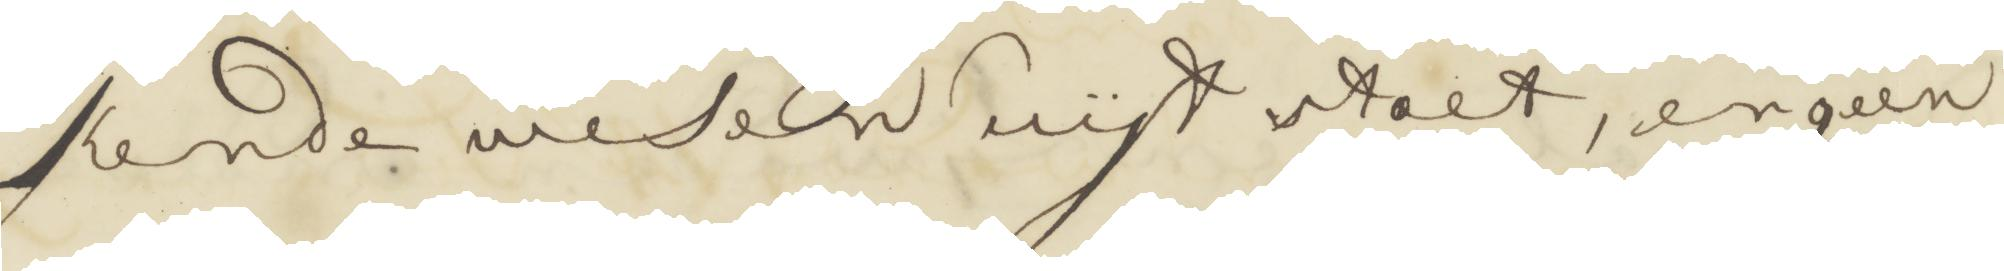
kende wesen uijt staet, en geen
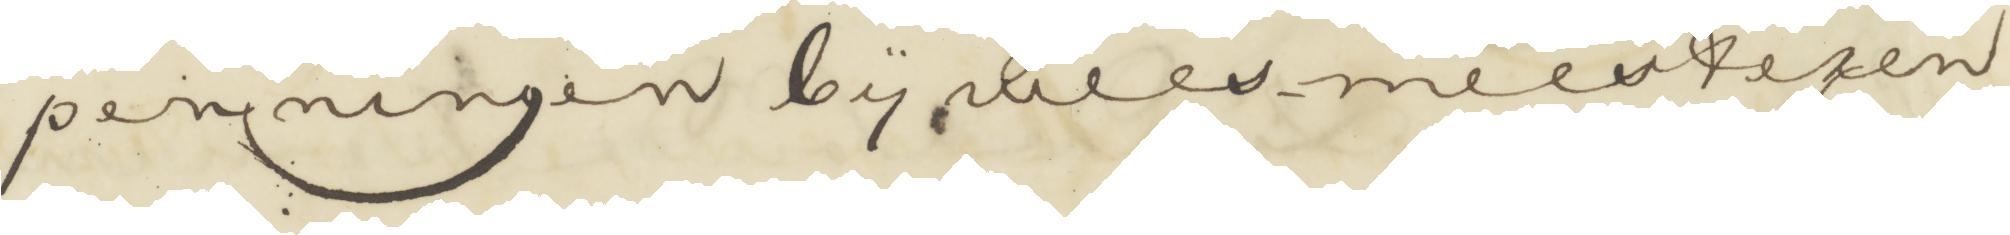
penningen bij wees-meesteren
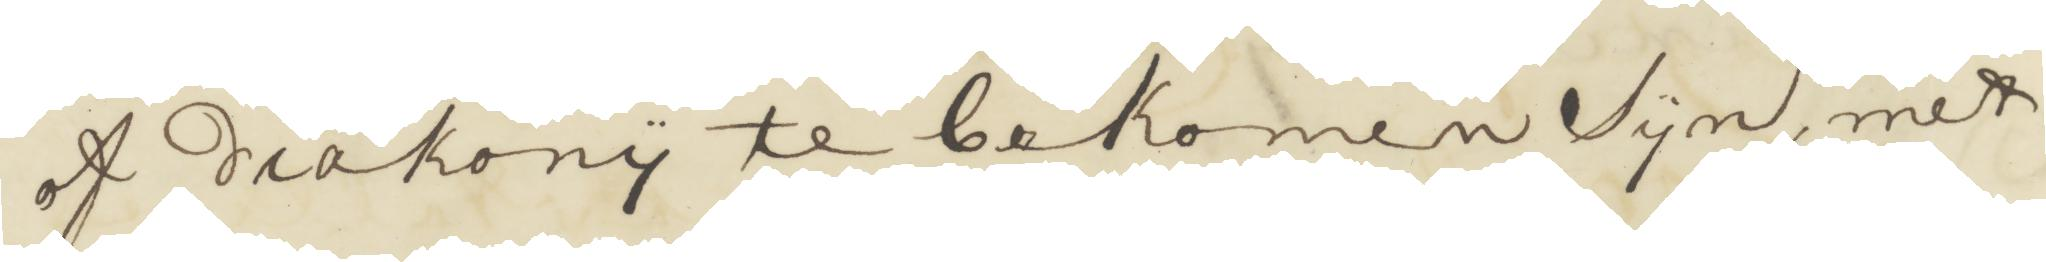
of diakonij te bekomen sijn, met
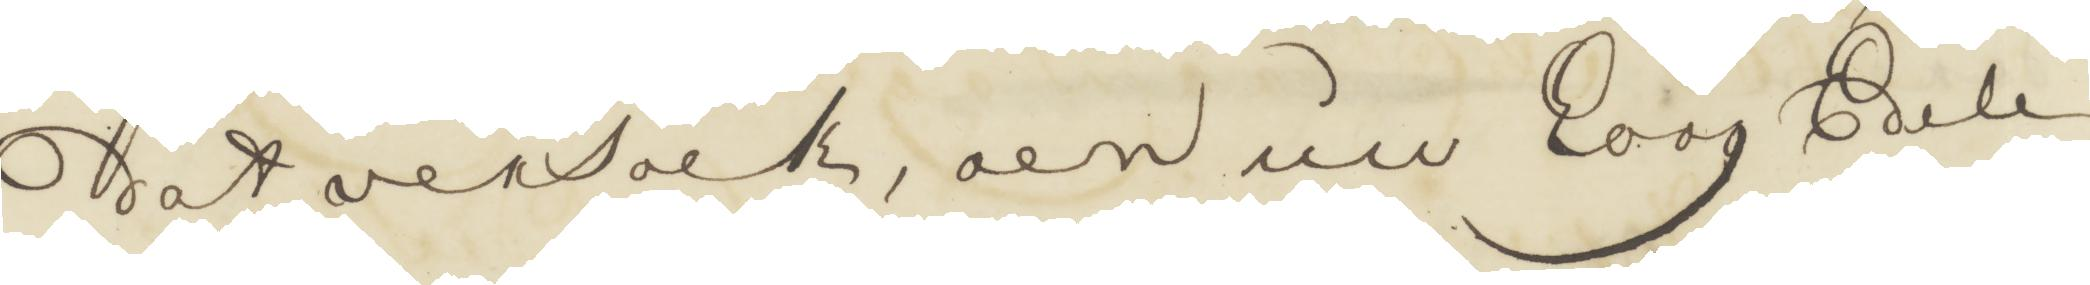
dat versoek, aen uw hoog Edele
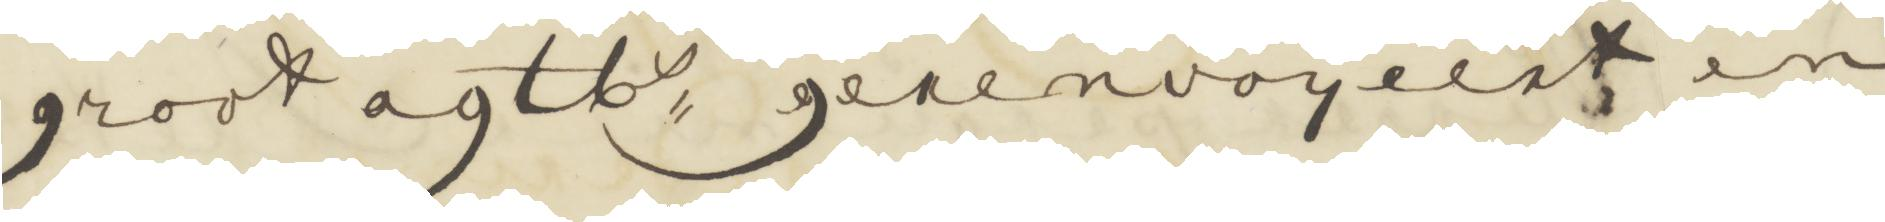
groot agtb„s gerenvoijeert en
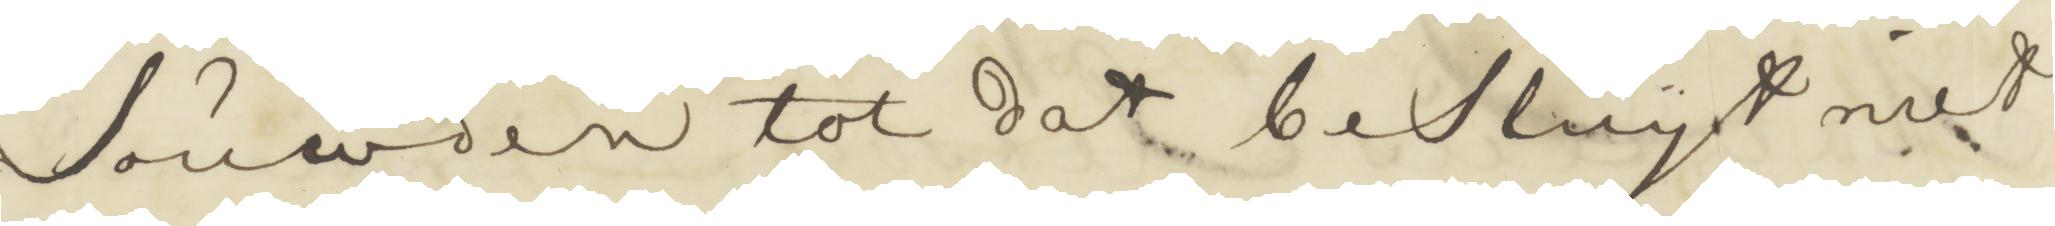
souwden tot dat besluijt niet
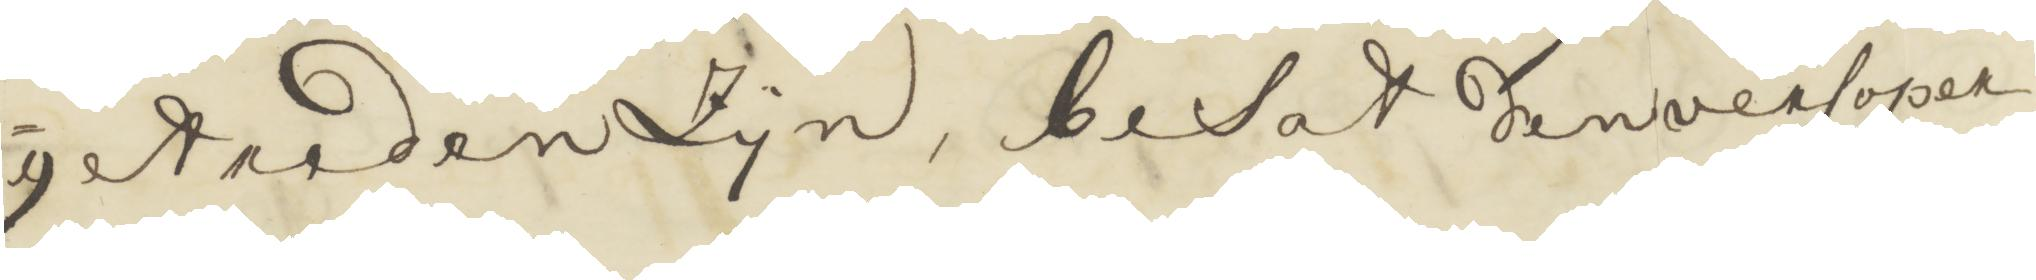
getreden zijn, besat den vercoper
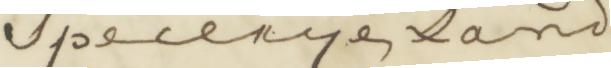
specerije Land
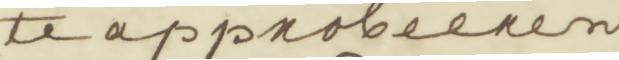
te approbeeren
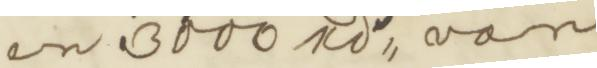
en 3000 rd„s van
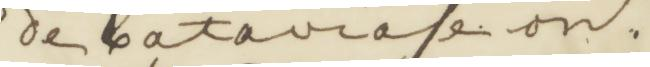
de bataviase on„
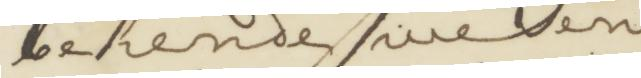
bekende wesen
